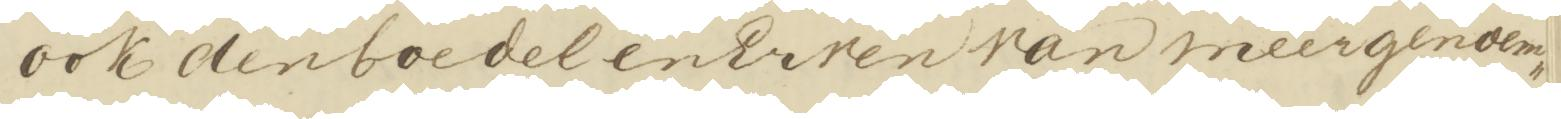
ook den boedel en Erven van meergenoem=
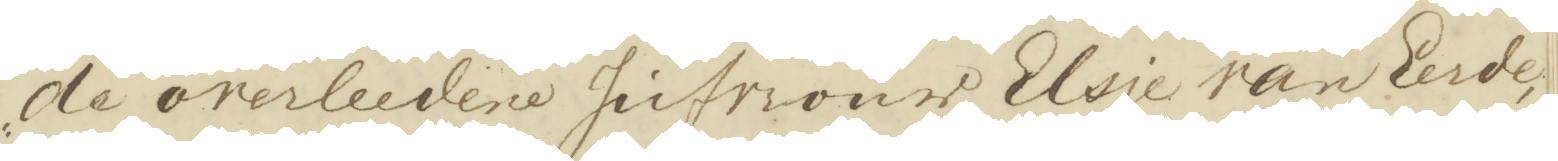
„de overleedene Jufvrouw Elsje van Eerde,
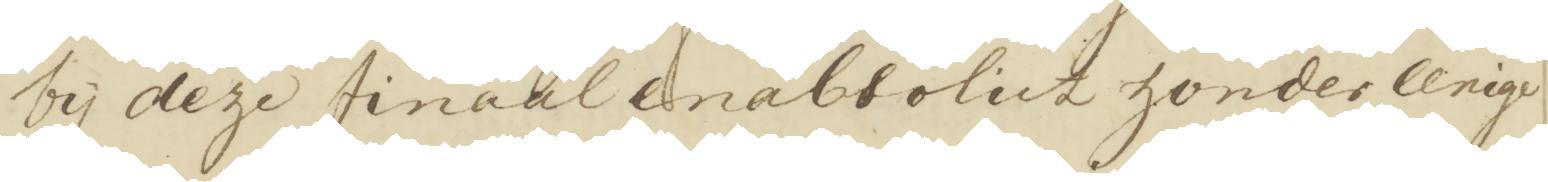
bij deze finaal en absolut zonder eenige
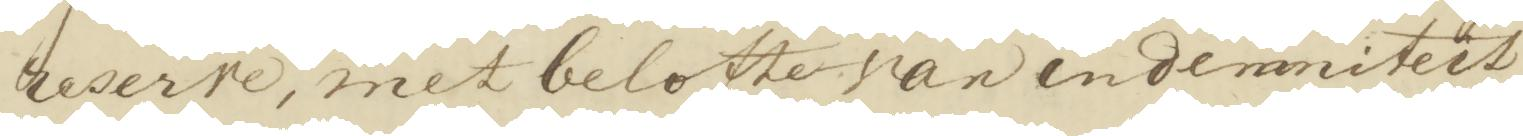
reserve, met belofte van indemniteit
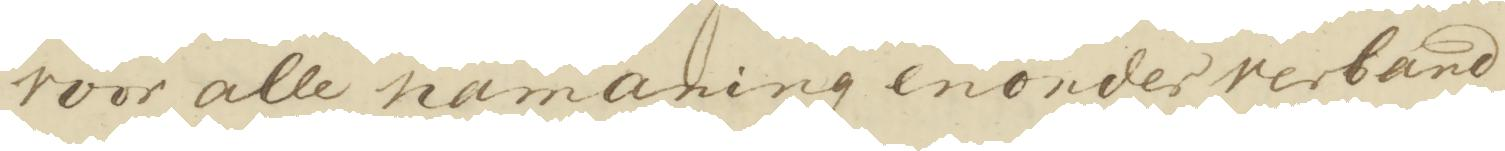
voor alle namaning en onder verband
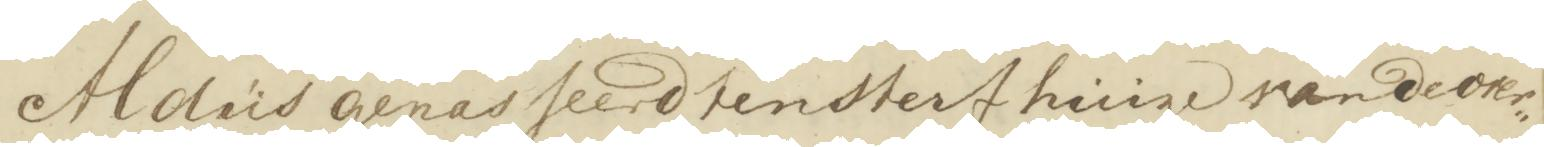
Aldus gepasseerd ten sterf huize van de over„
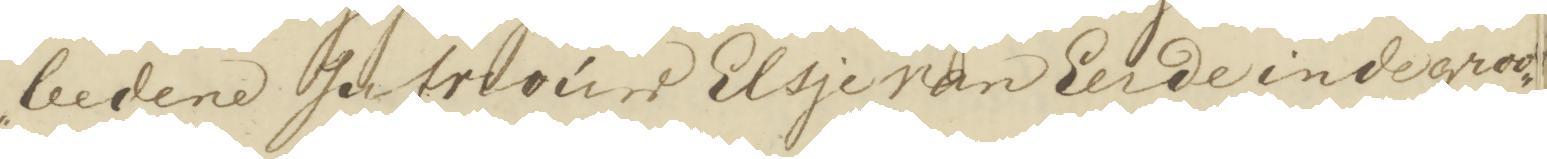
„leedene Jufvrouw Elsje van Eerde in de groo„
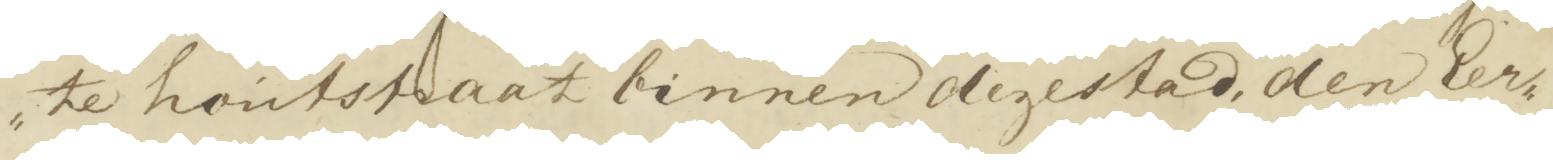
„te houtstraat binnen deze stad, den Eer„
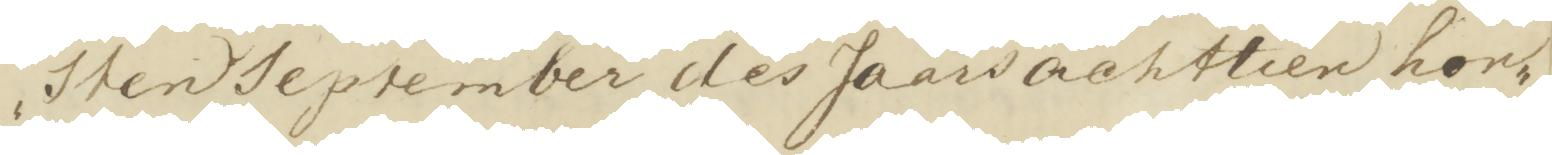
„sten september des Jaars achttien hon„
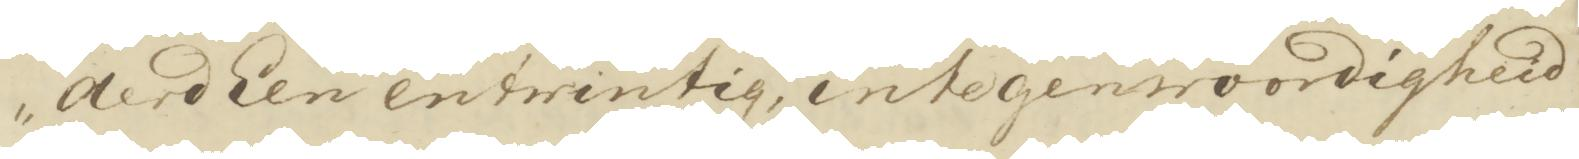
„derd Een en twintig, integenwoordigheid
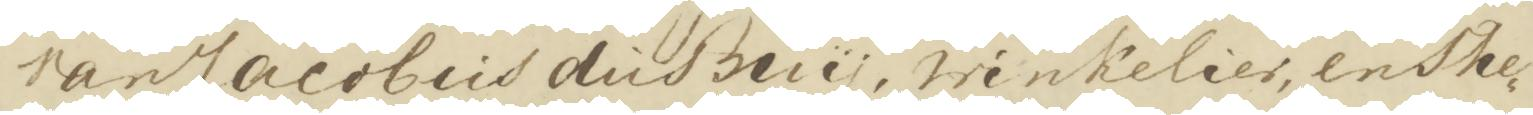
van Jacobus dus Buij, winkelier, en Theo„
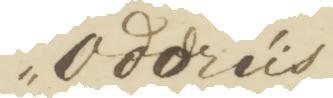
„odorus
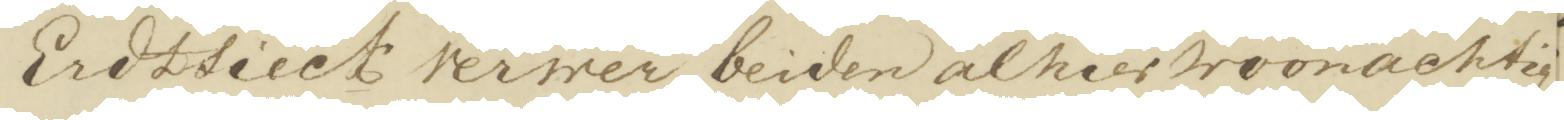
Erdtsieck verver, beiden alhier woonachtig
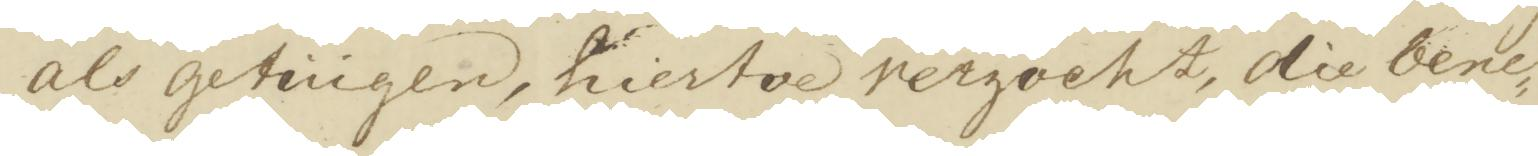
als getuigen, hiertoe verzocht, die bene„
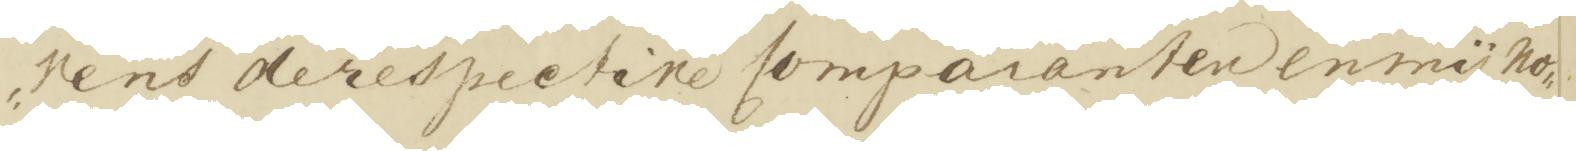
„vens de respective comparanten en mij no„
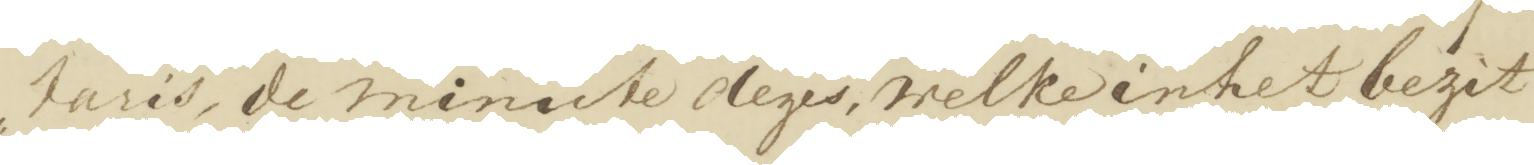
„taris, de minute dezes, welke in het bezit
